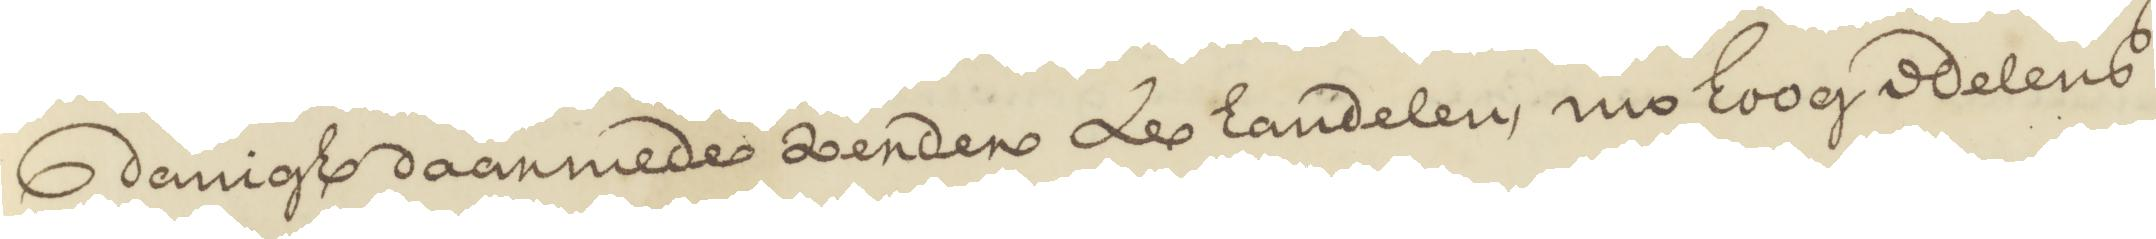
danigh daarmede verder te handelen, uw hoog Edelens
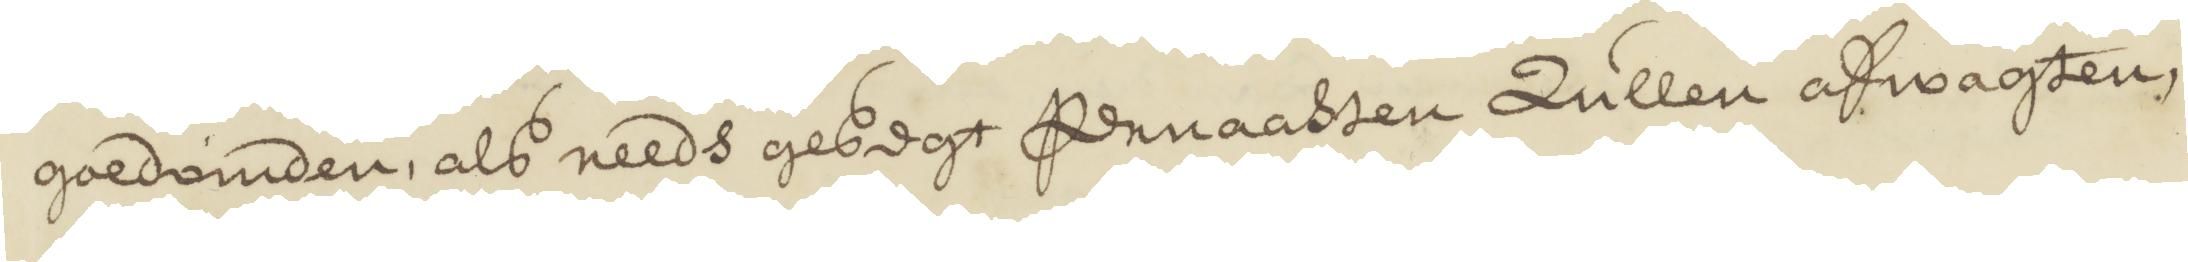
goedvinden, als reeds gesegt per naasten Zullen afwagten,
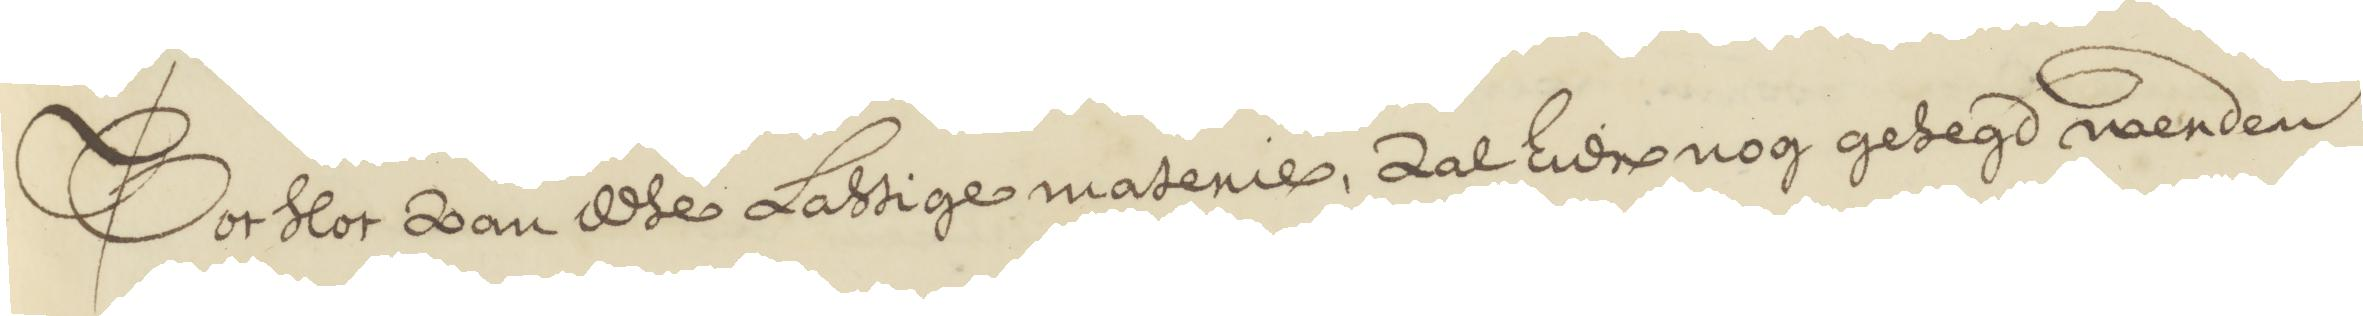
Tot slot van dese Lastige materie, zal hier nog gesegd werden
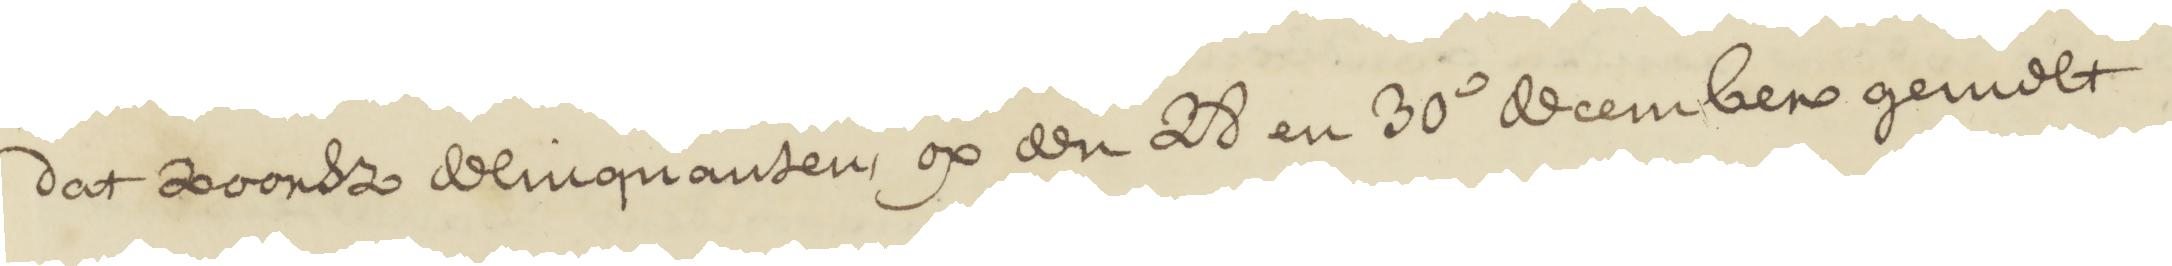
dat voorsz delinquanten, op den 28 en 30' december gemelt
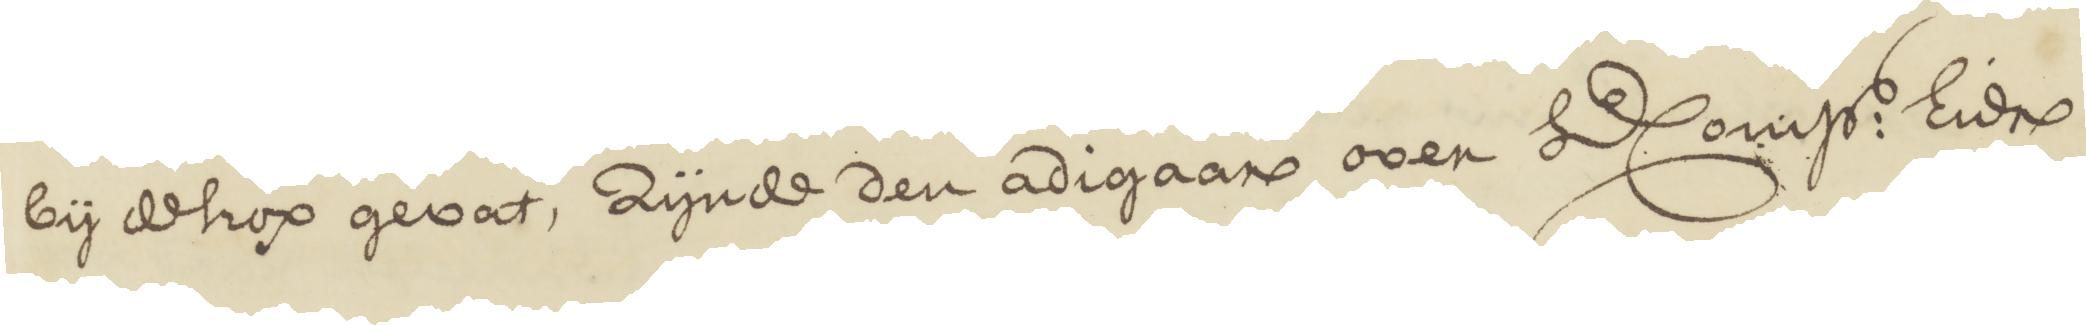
bij de kop gevat, Zijnde den adigaar over sEComp:s hier
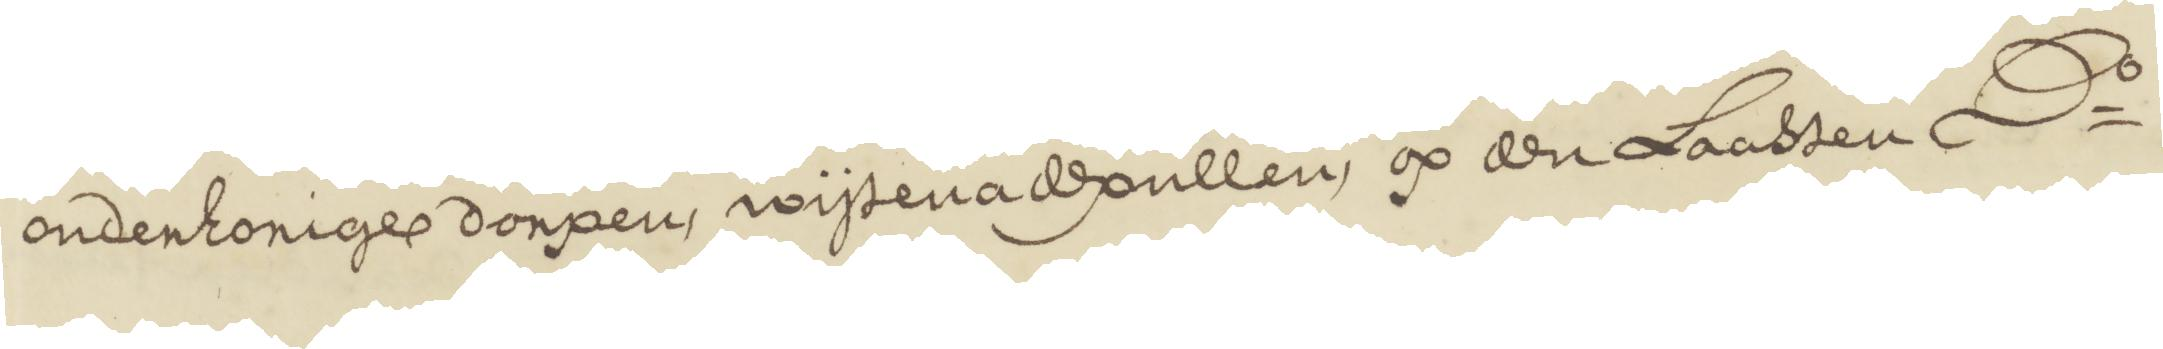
onderhorige dorpen, wijtena depullen, op den Laasten D=o
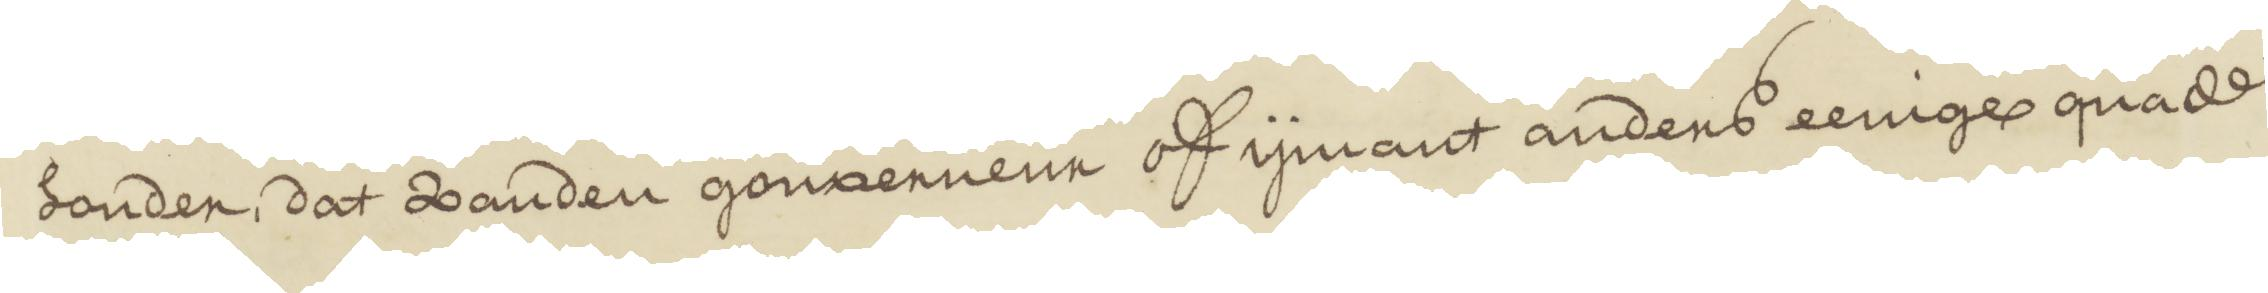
sonder, dat vanden gouverneur of ijmant anders eenige quade
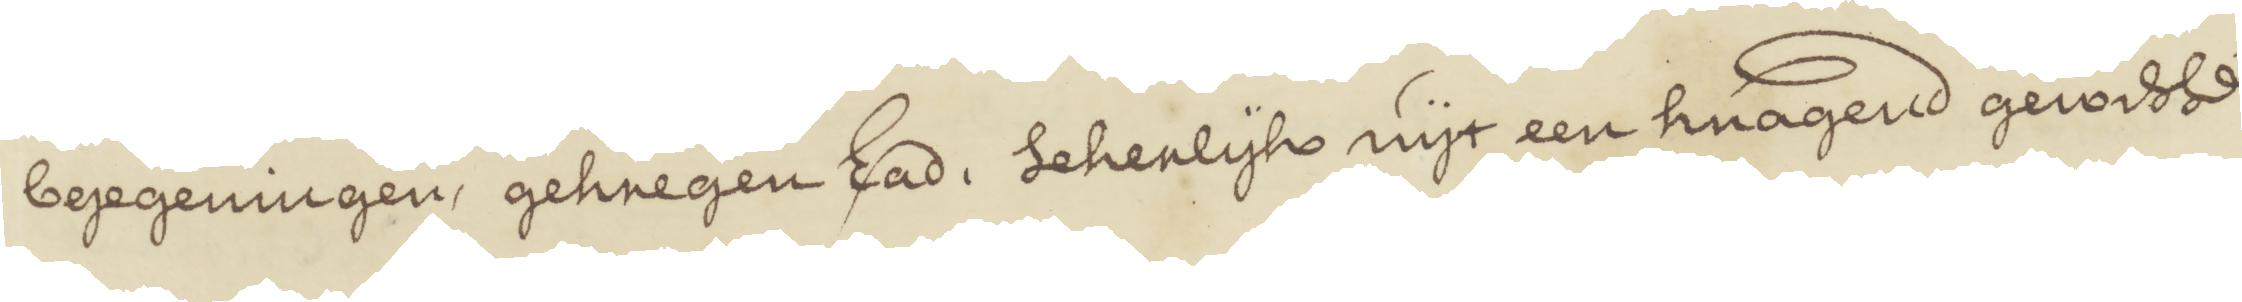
bejegeningen, gekregen had, sekerlijk uijt een knagend gewisse
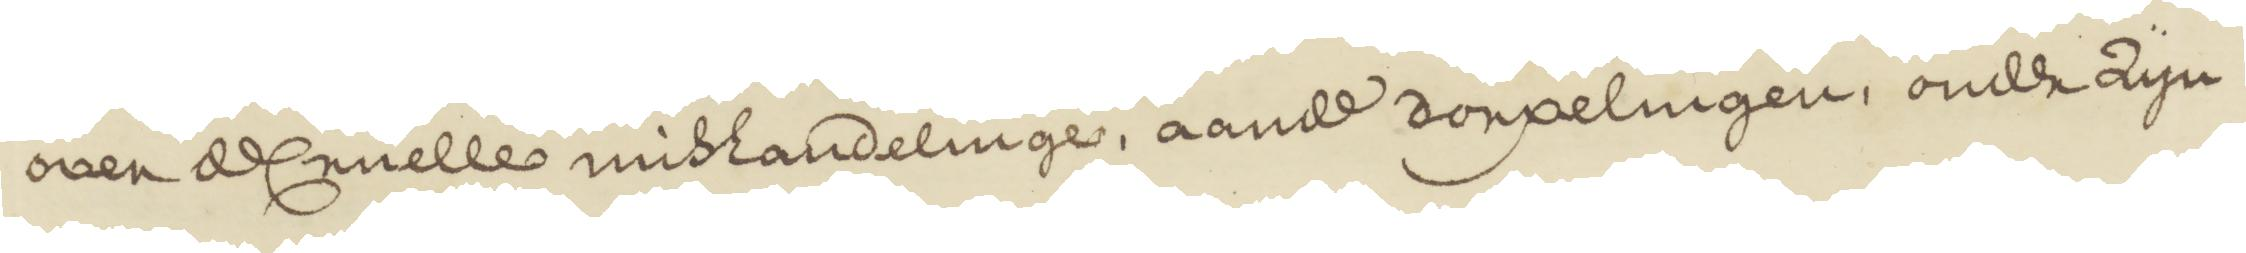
over de Cruelle mishandelinge, aande dorpelingen, onder Zijn
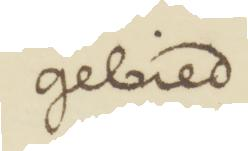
gebied
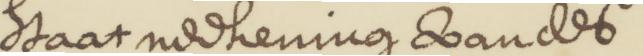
staat reekening van des
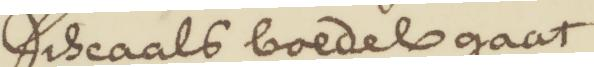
fiscaals boedel gaat
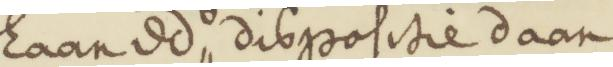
haar Ed„s dispositie daar
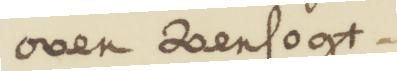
over versogt
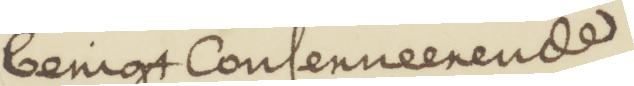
berigt conserneerende
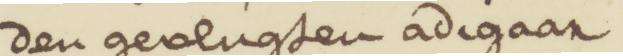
den gevlugten adigaar
